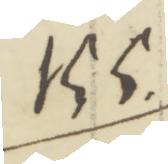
155.
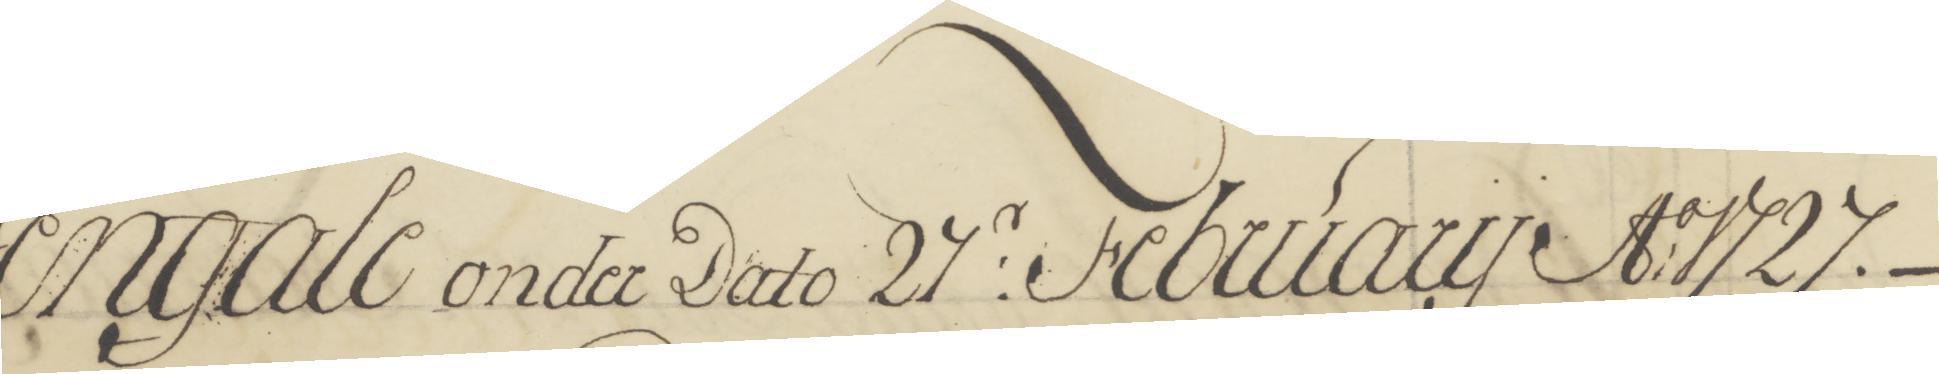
Van Bengale onder Dato 27:' Februarij A:o 1727.
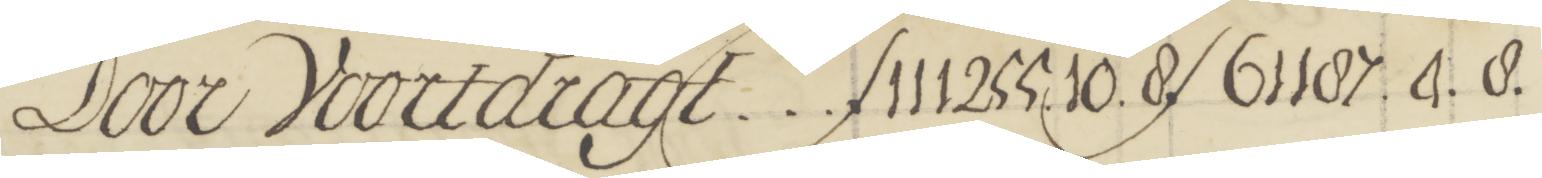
Door Voortdragt . . . ƒ111255.10. 8 ƒ61187.4.8.
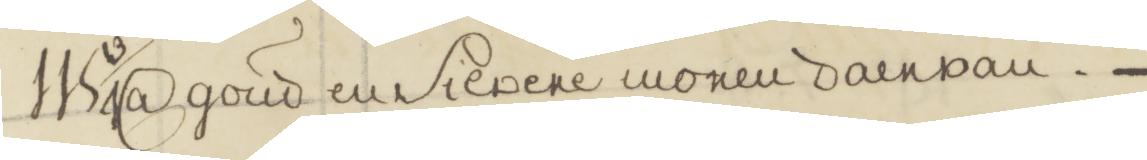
115¾@ goud en Silvere moren daervan.
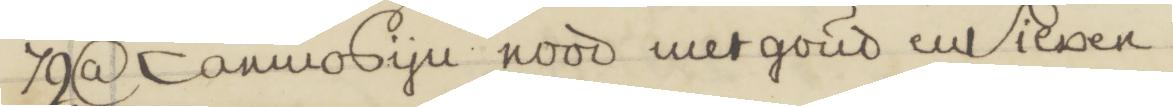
79@ carmosijn rood met goud en silver
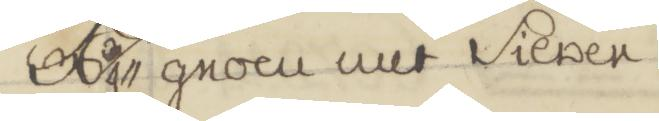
36¾„ groen met silver
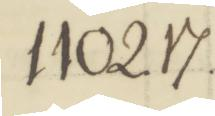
1102.17
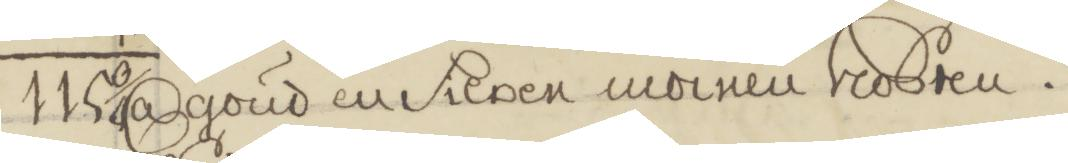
115¾@ goud en Silver moiren kosten .
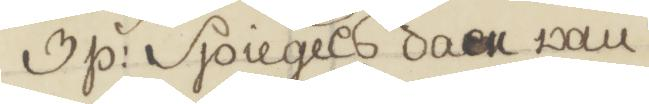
3 p:s Spiegels daer van
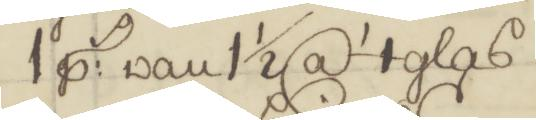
1 p:s van 1½@ 't glas
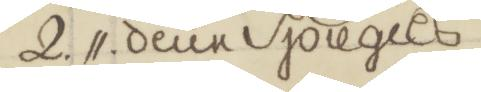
2. „. deur Spiegels
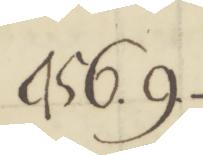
456. 9.
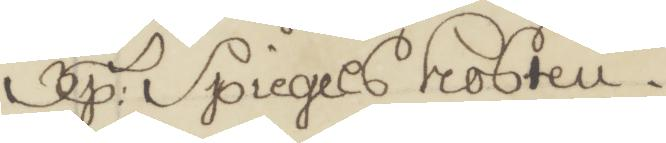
3p:s Spiegels kosten .
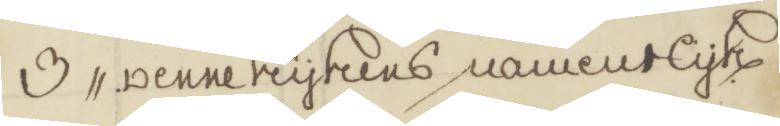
3 „ verrekijkers namentlijk
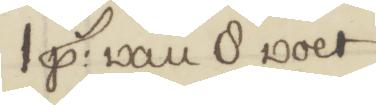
1 p:s van 8 voet
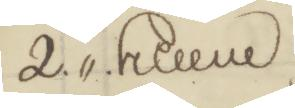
2. „. kleene
